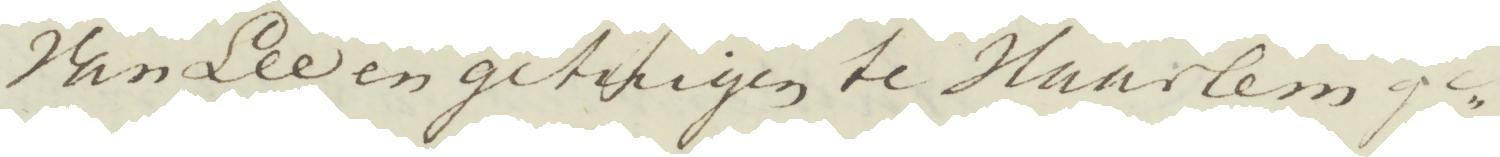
Van Lee en getuigen te Haarlem ge„
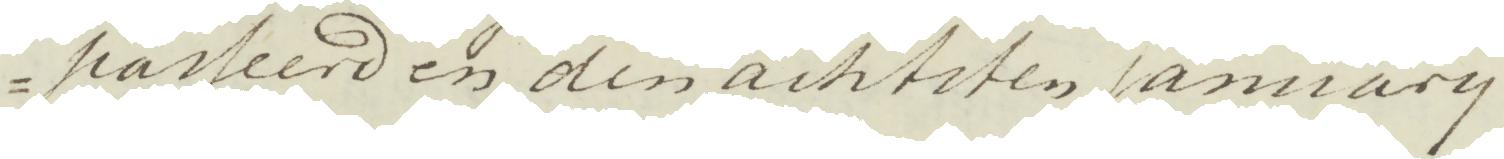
= passeerd en den achtsten January
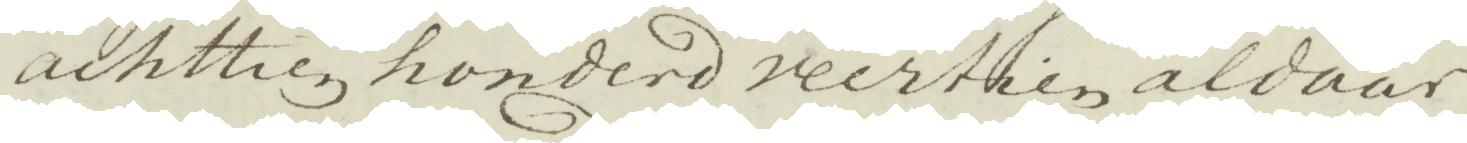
achttien honderd veertien aldaar
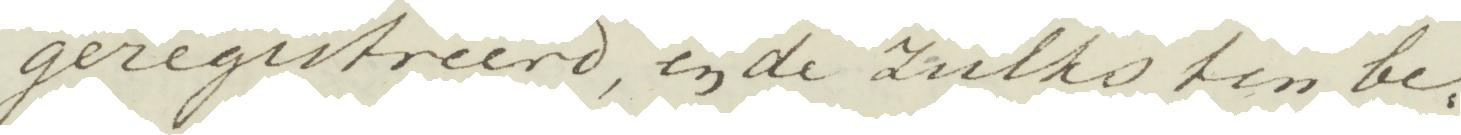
geregistreerd, ende zulks ten be„
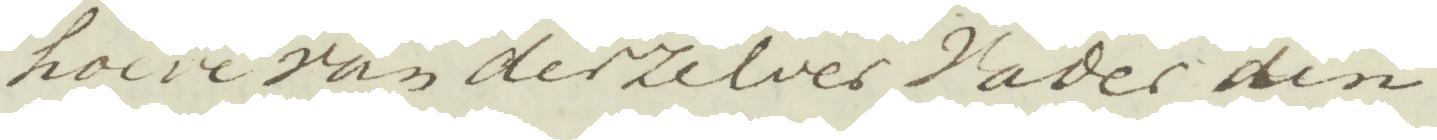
hoeve van derzelver Vader den
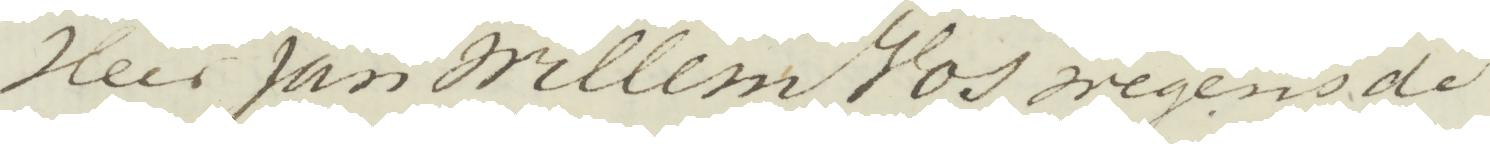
Heer Jan Willem Vos wegens de
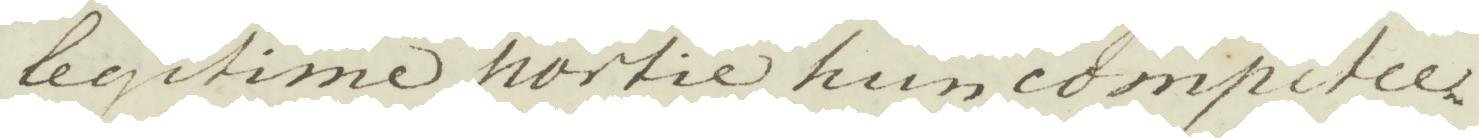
legitime portie hun competee„
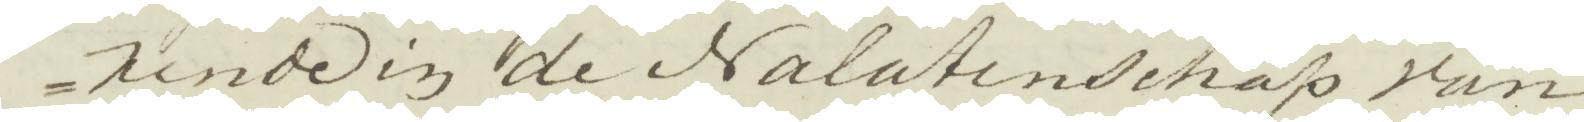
=rende in de Nalatenschap van
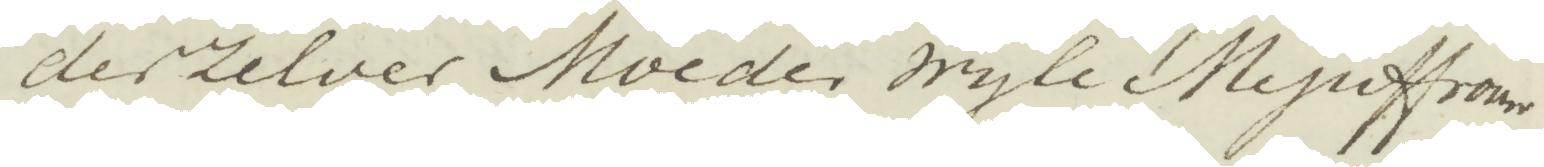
derzelver Moeder wijle Mejuffrouw
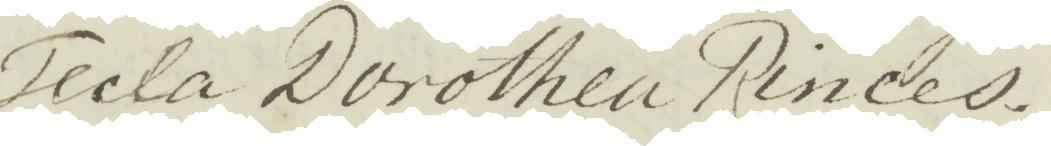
Tecla Dorothea Rinces.
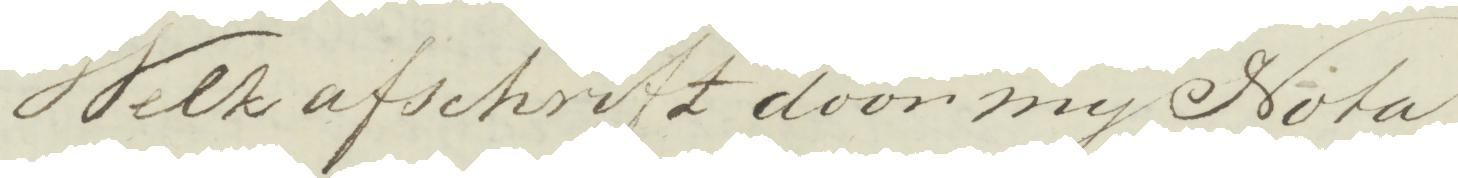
Welk afschrift door mij Nota
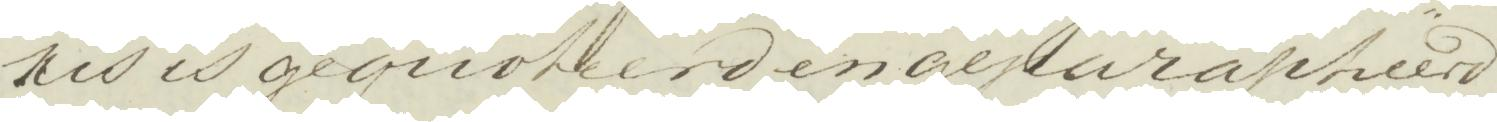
ris is gequoteerd en geparapheerd
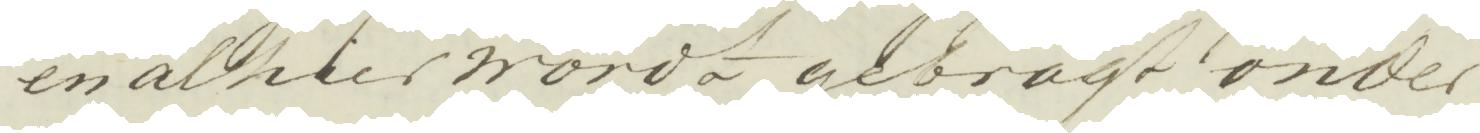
en alhier wordt gebragt onde
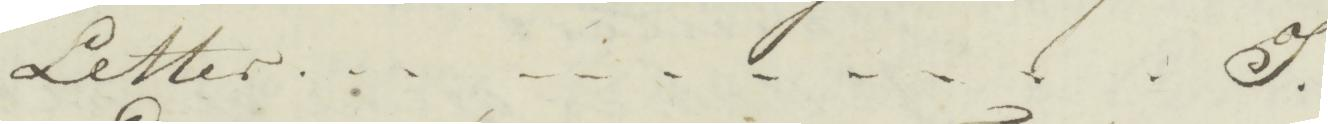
Letter. J.
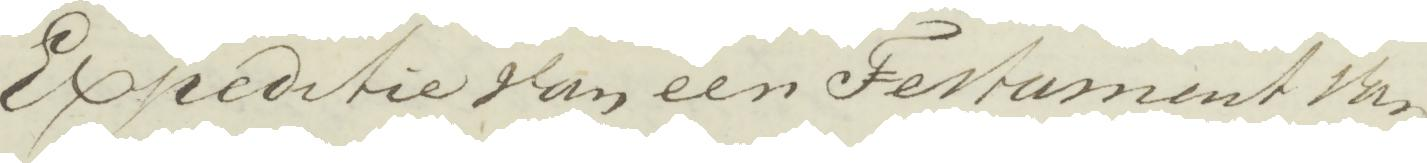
Expeditie van een Testament van
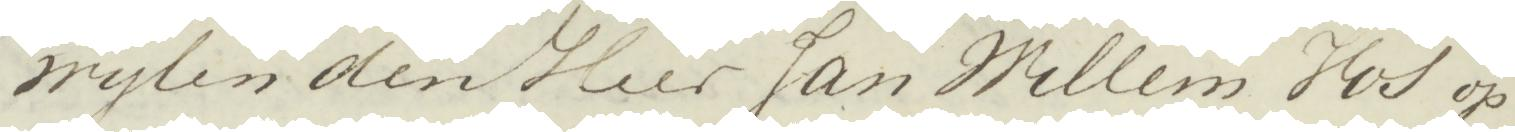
wylen den Heer Jan Willem Vos op
